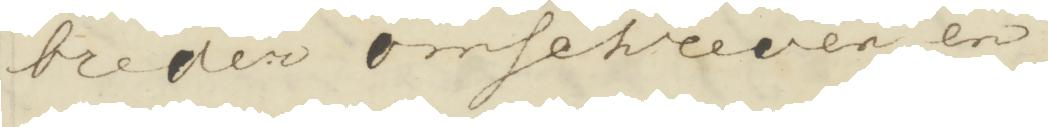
breder omschreven en
